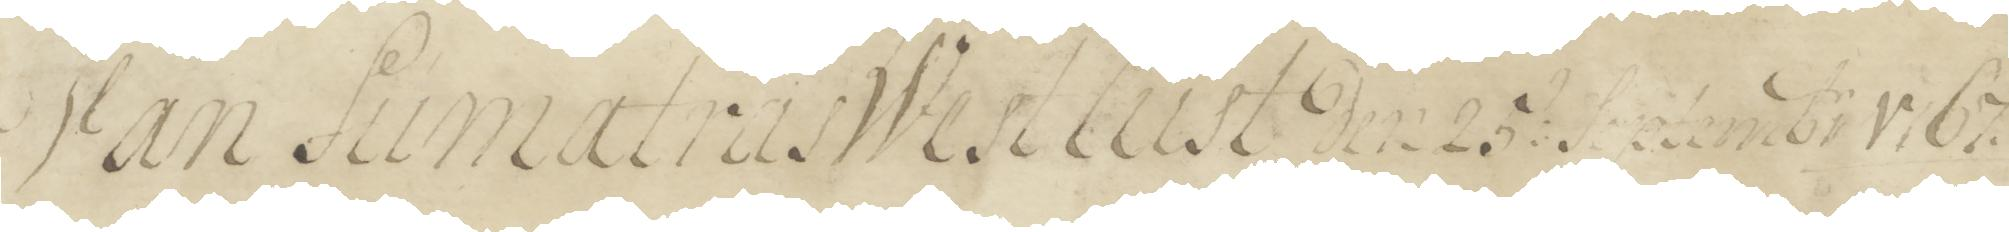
Van Sumatras West Cust den 25:' septemb„r 1767.
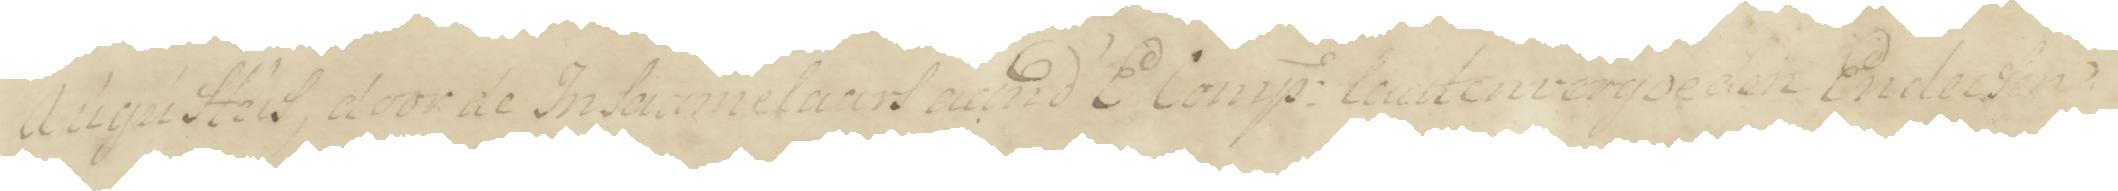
Augustus, door de Jnsamelaars aan d'E Comp:s laaten vergoeden aan En deesen
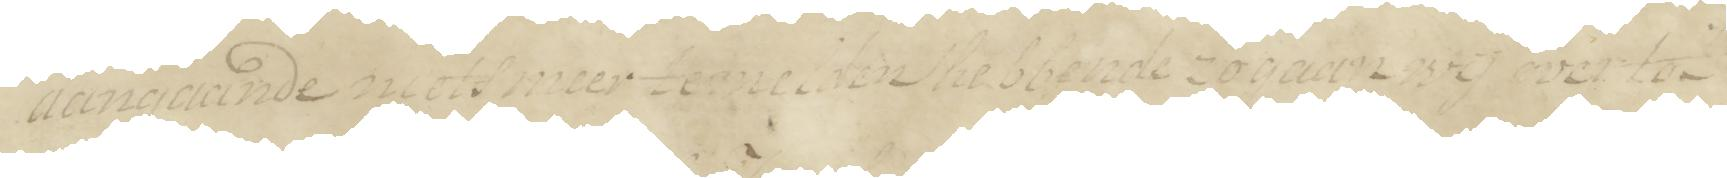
aangaande mits meer te welken hebbende zo gaan wij over tot
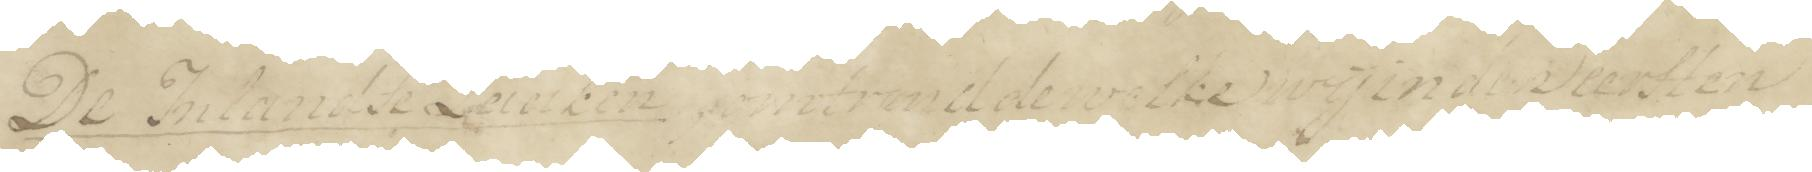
De Jnlandse zaaken omtrend de welke wij in den eersten
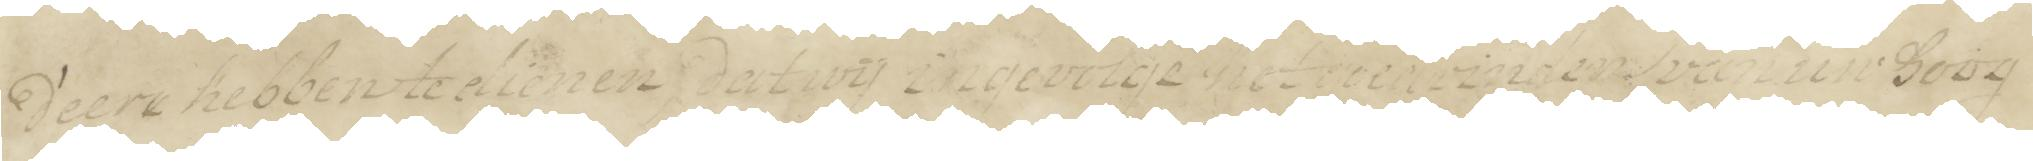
d'eere hebben te dienen dat wij in gevolge het goed in den van uw hoog
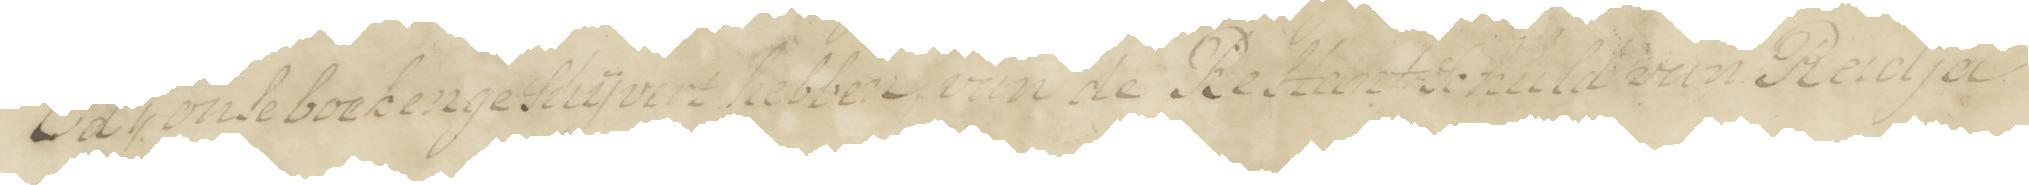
Ed„s onse boeken gesuijvert hebben van de Restant schuld van Radja
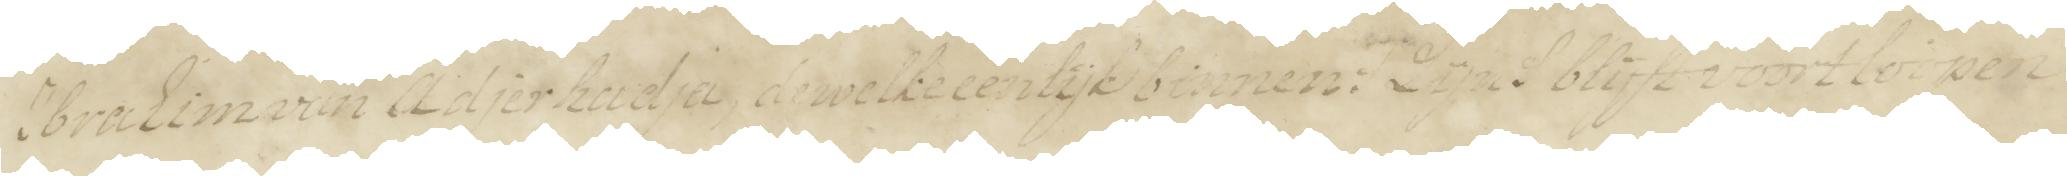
Jbrahim van Adjerhadja, dewelke eenlijk binnen: zijns blijft voortloopen
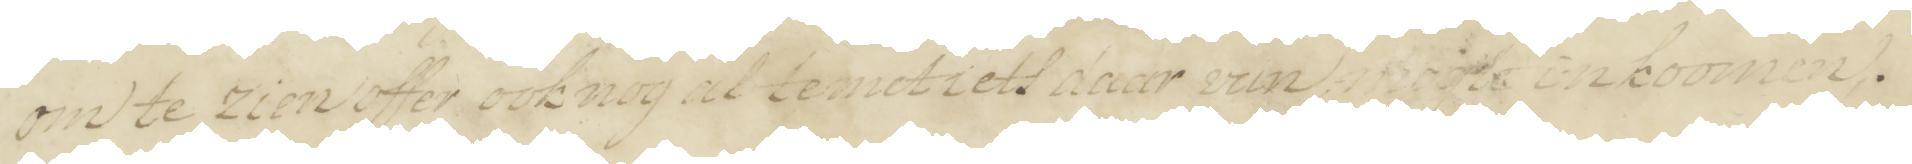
om te zien offer ook nog al te met iets daar van mogte inkoomen.
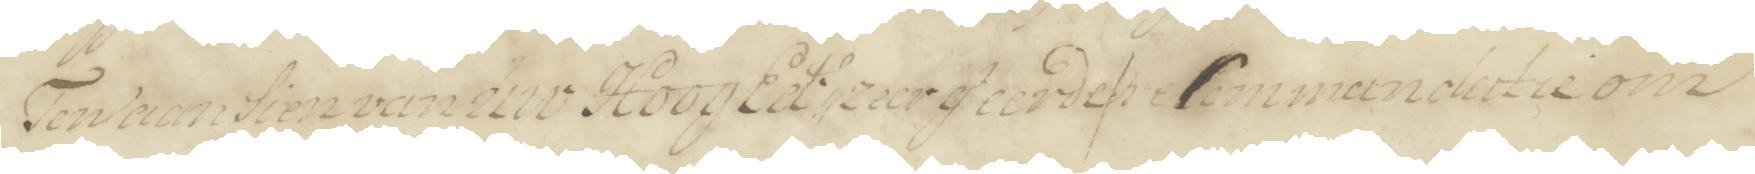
Ten aansien van uw Hoog Ed„s zeer g'eerde recommandatie om
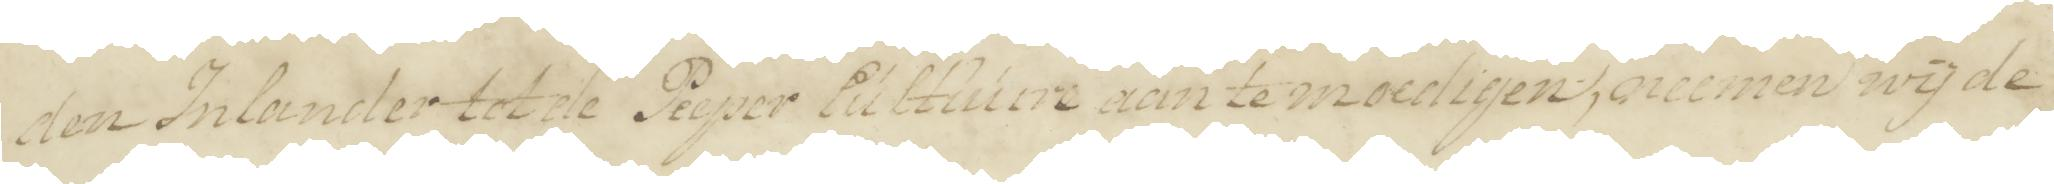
den Jnlander tot de Peeper Cultuure aan te moedigen, neemen wij de
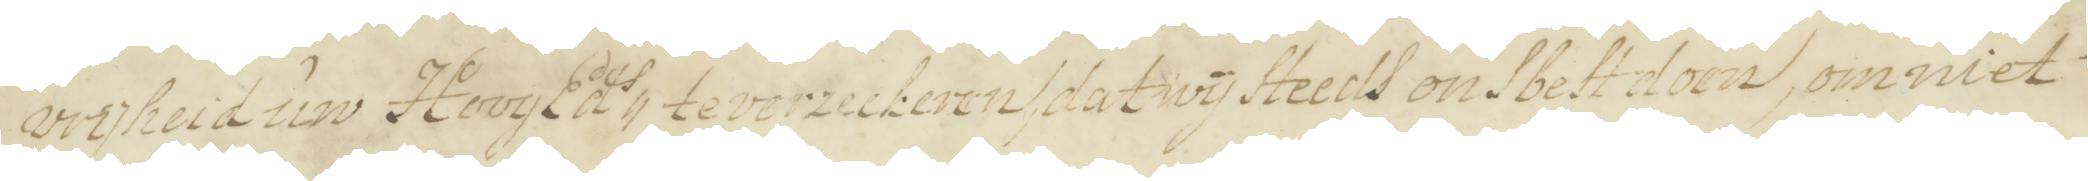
vrijheid uw Hoog Ed„s te verzeckeren, dat wij steeds ons best doen, om niet
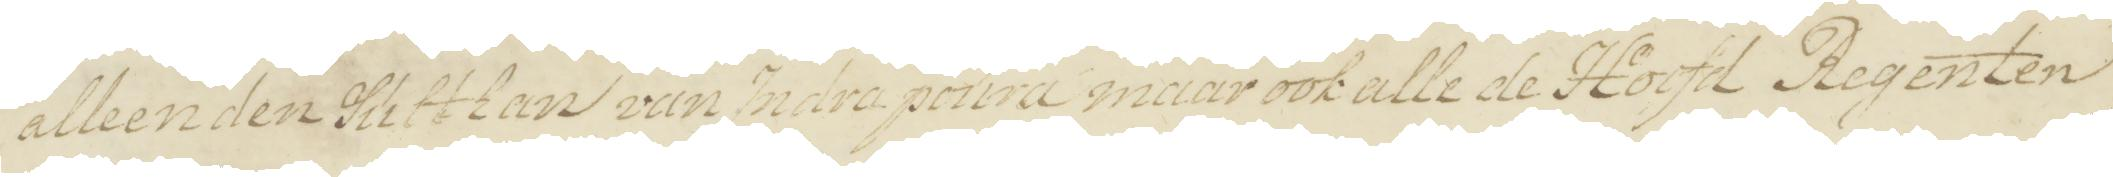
alleen den sulthan van Jndra poura maar ook alle de Hoofd Regenten
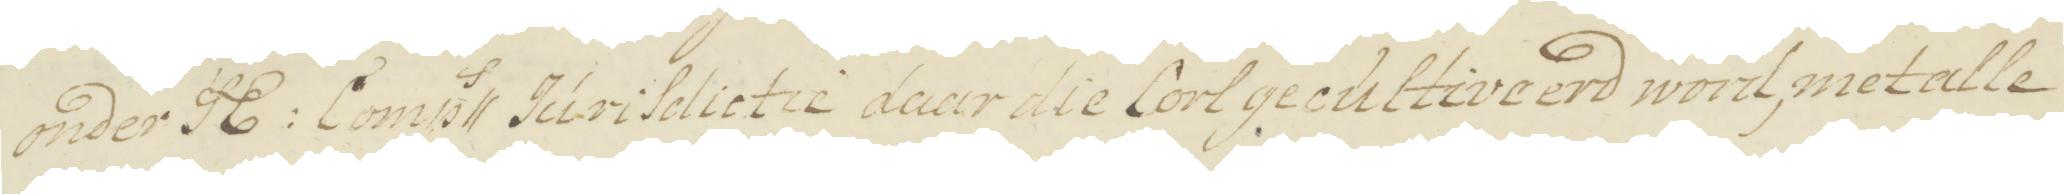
onder SE: Comp„s Jurisdictie daar die Corl gecultiveerd word, met alle
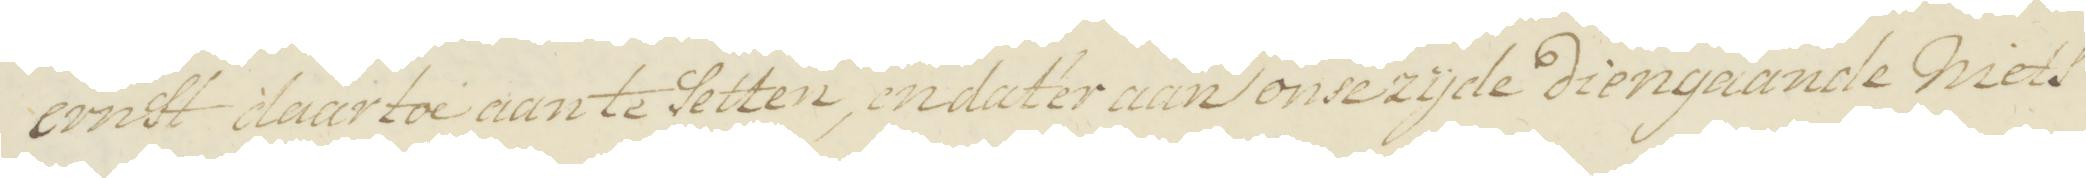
ernst daartoe aan te setten, en dat'er aan onse zijde diengaande niets
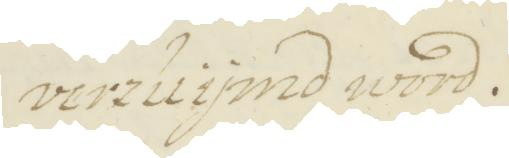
verzuijmd word.
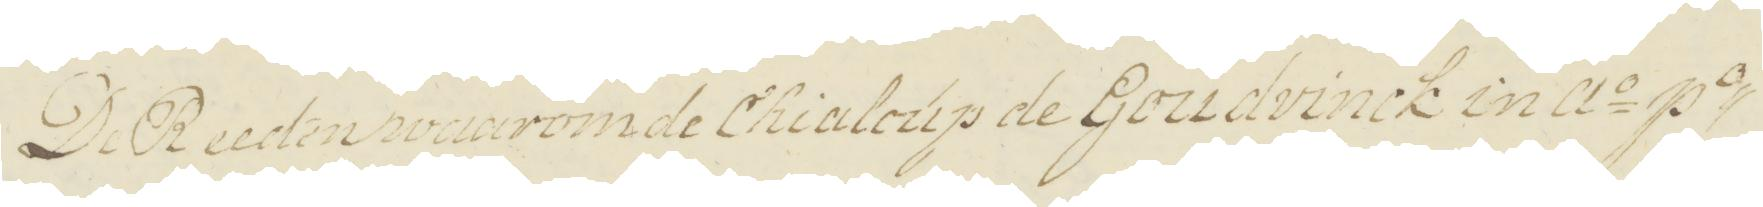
De Reeden waarom de Chialoup de Goudvinck in a=o p„o
